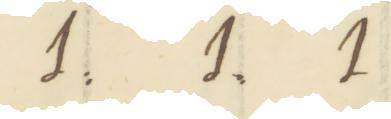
1„ 1„ 1
